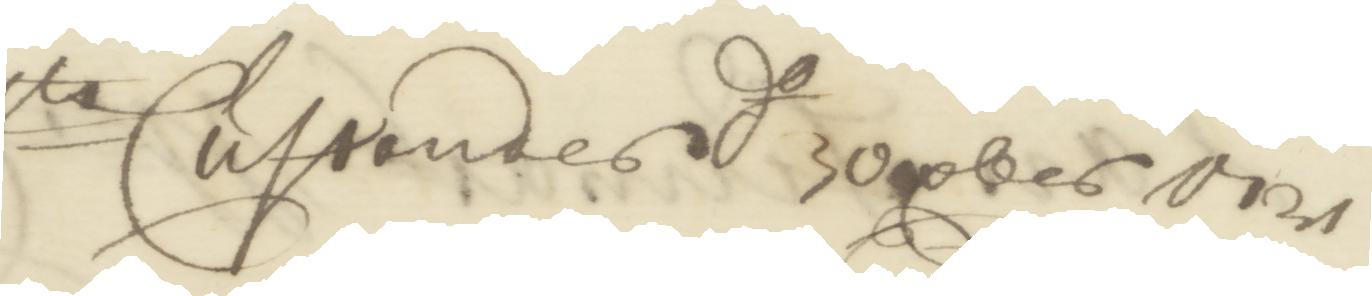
W=t Cust onder d-o 30 xber 1731
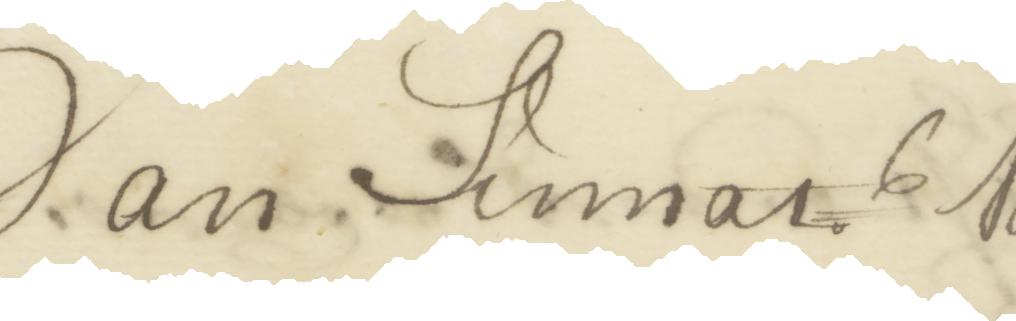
Van Sumat=s
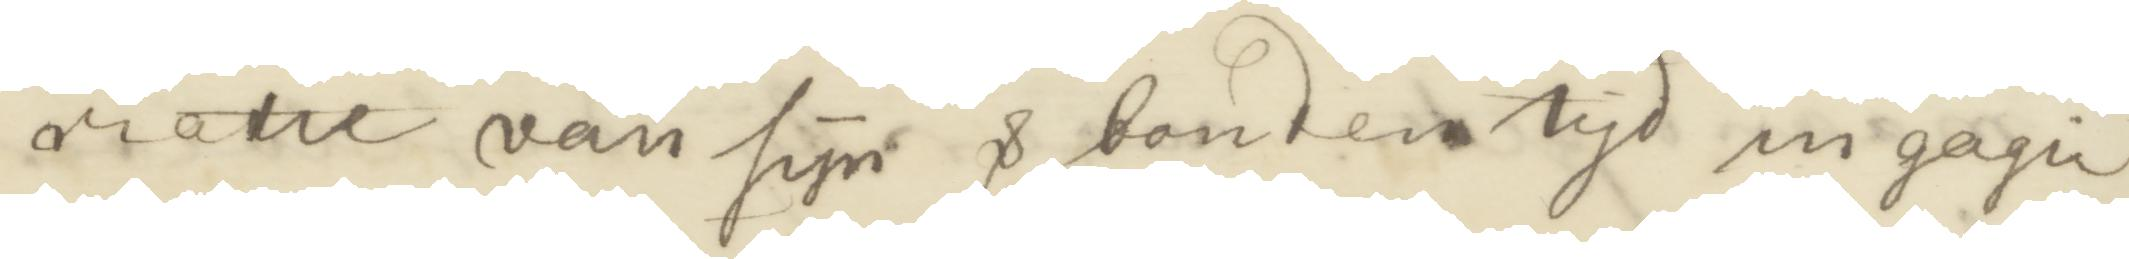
riatie van sijn verbonden tijd in gagie
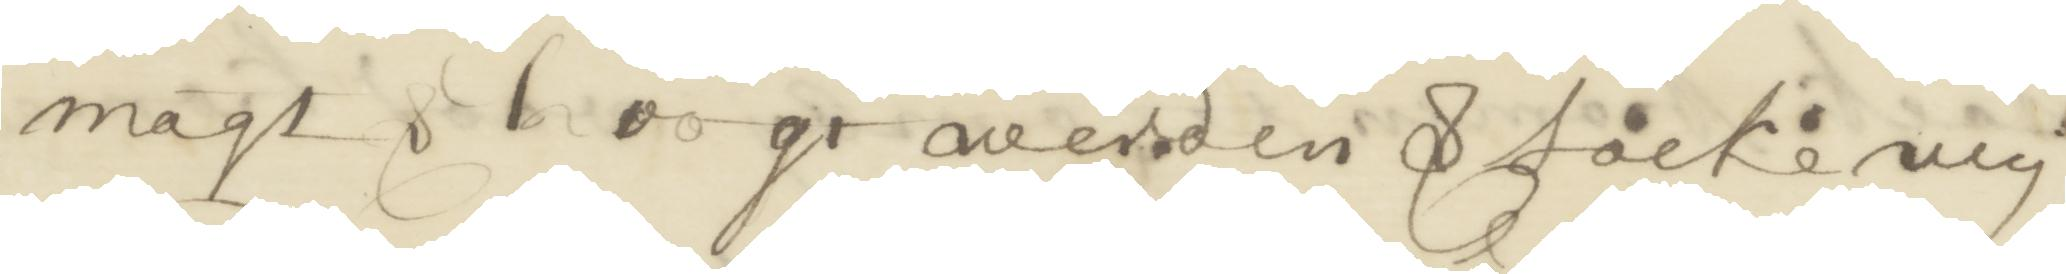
mogt verhoogt werden versoeke nog
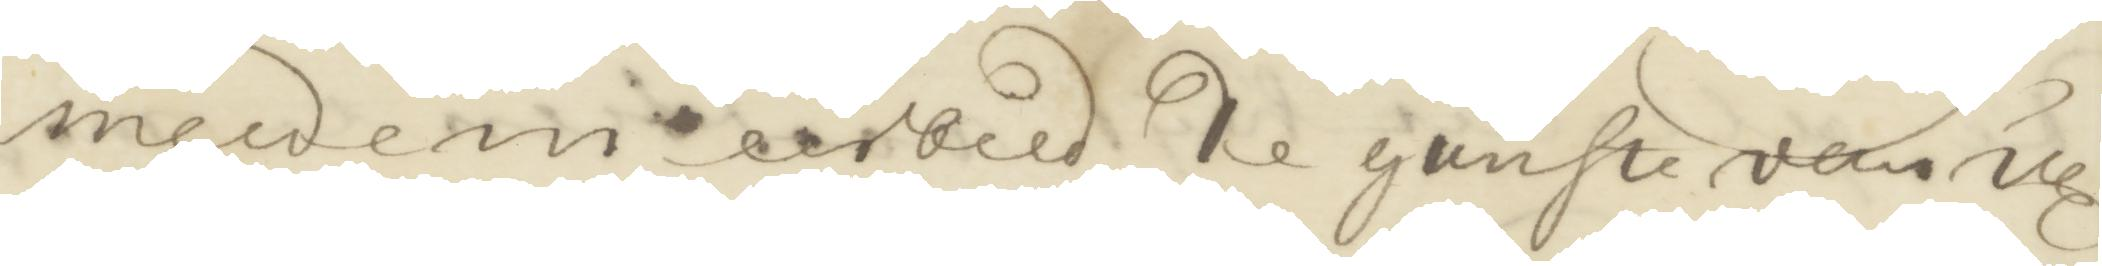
meede in eerbied te gunste van UE
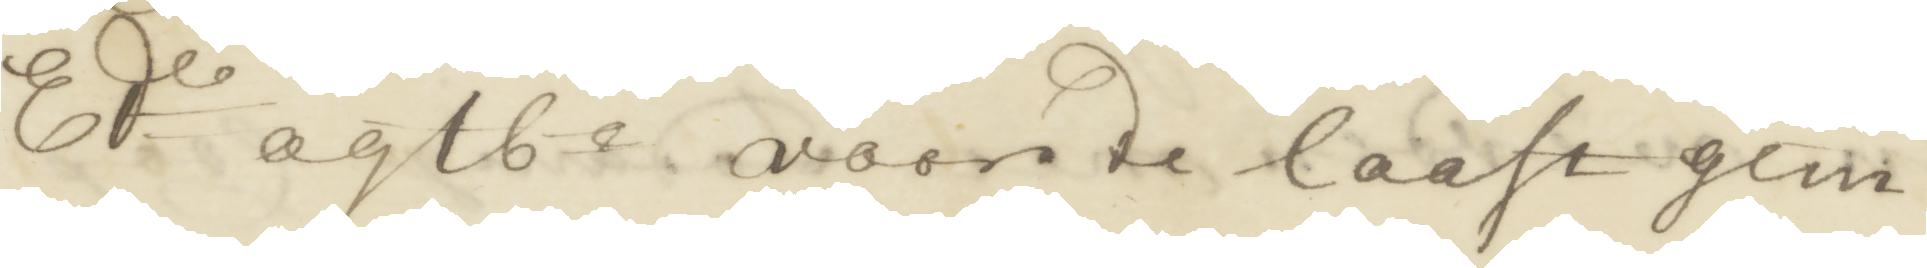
Ed=e agtb=e voor de laast gem
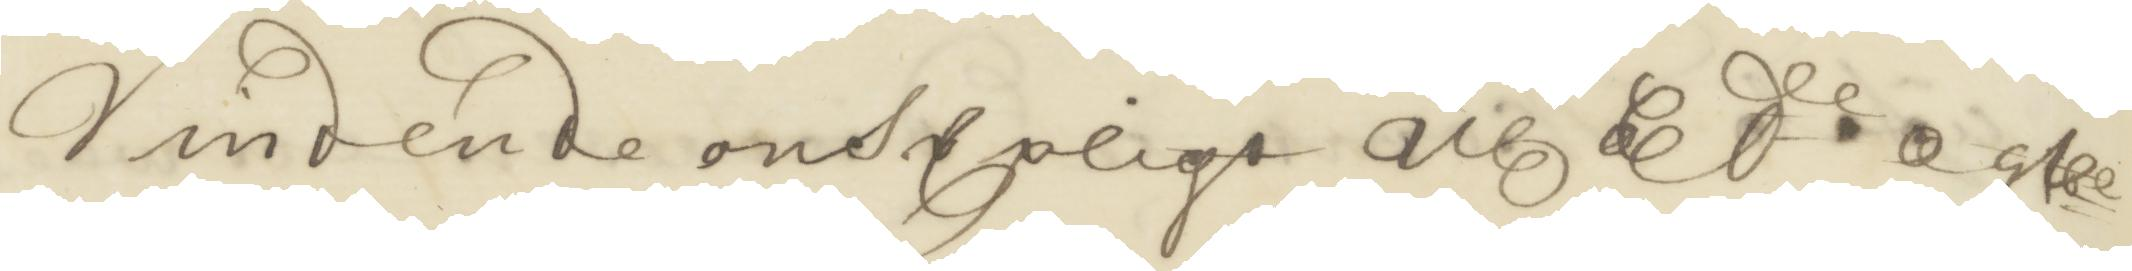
vindende ons verpligt UE Ed=e agtb=e
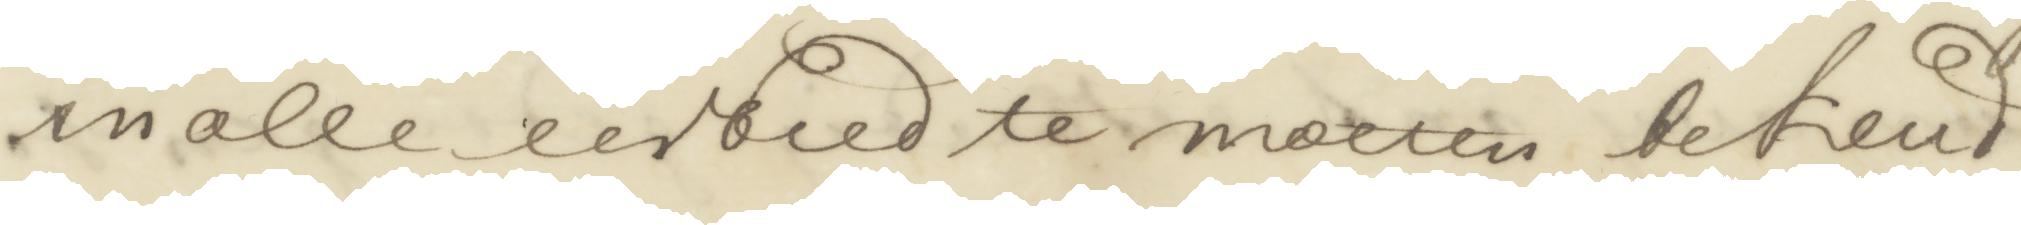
in alle eerbied te moeten bekend
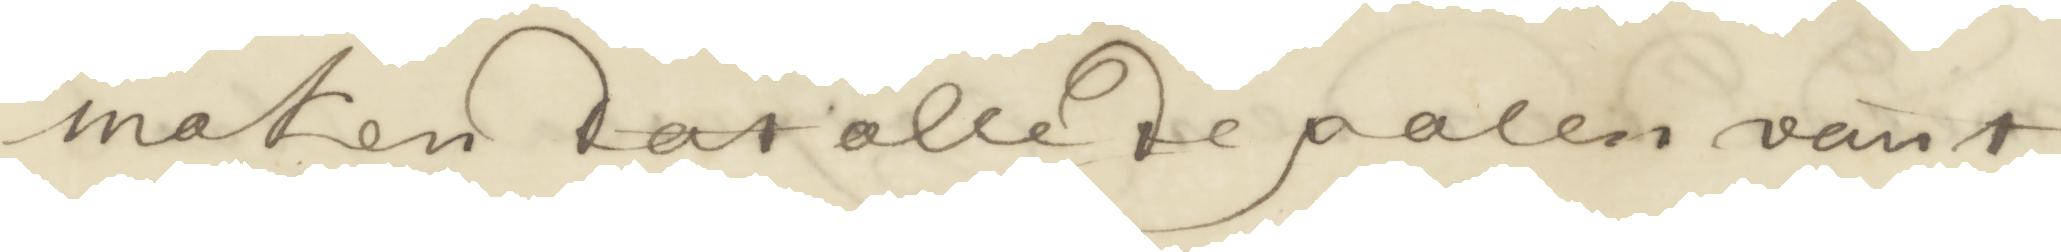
maken dat alle de palen van’t
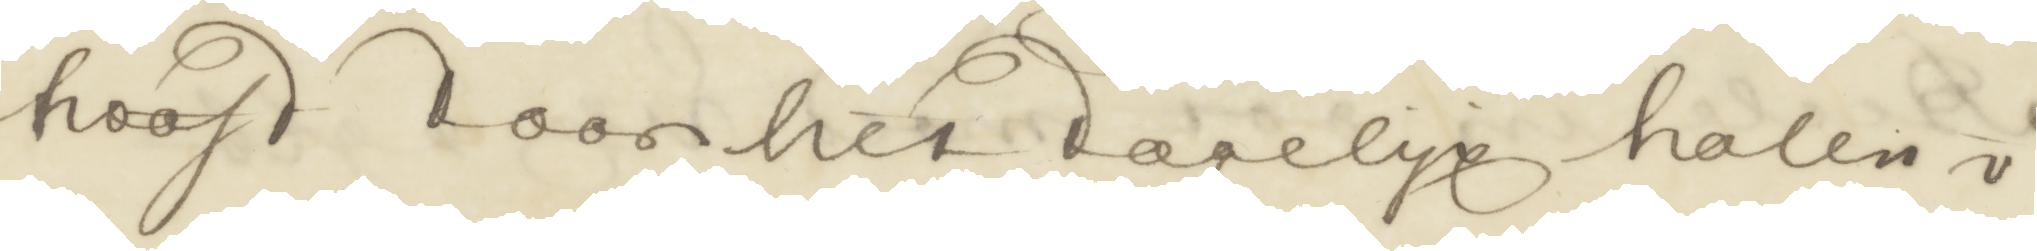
hoofd door het dagelijx halen v
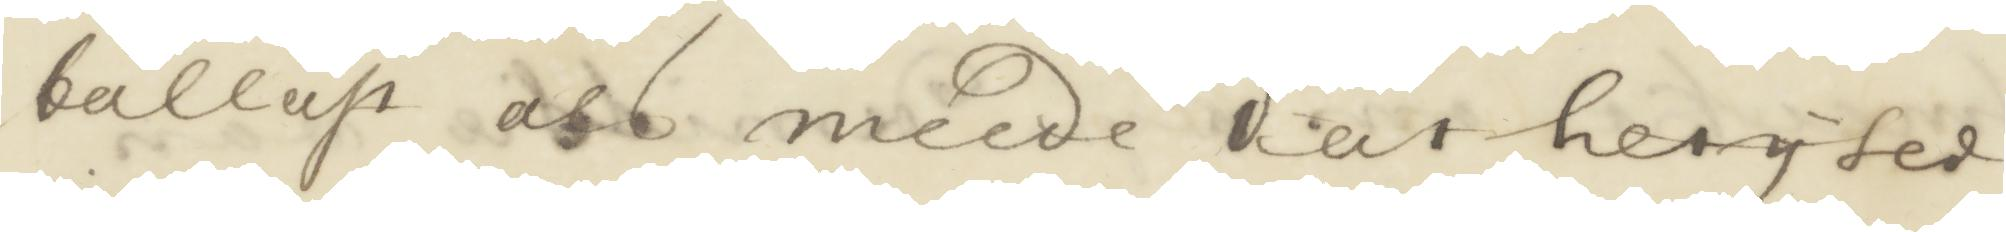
ballast als meede dat het yser
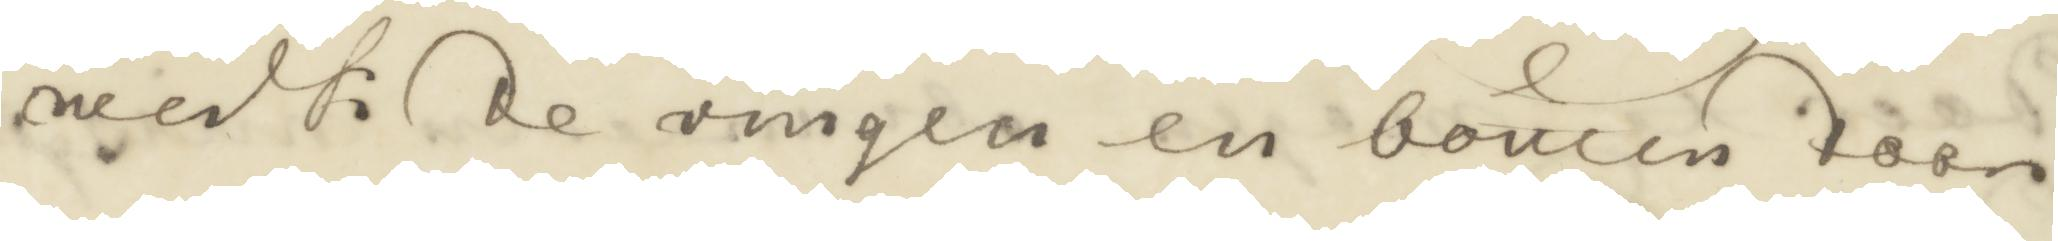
werk de ringen en bouten door
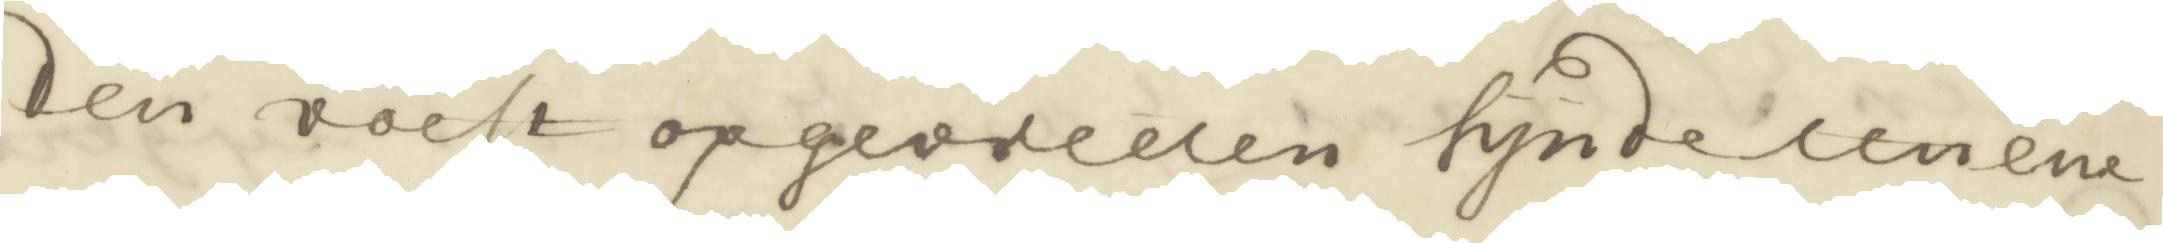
den roest opgevreeten sijnde ten ene
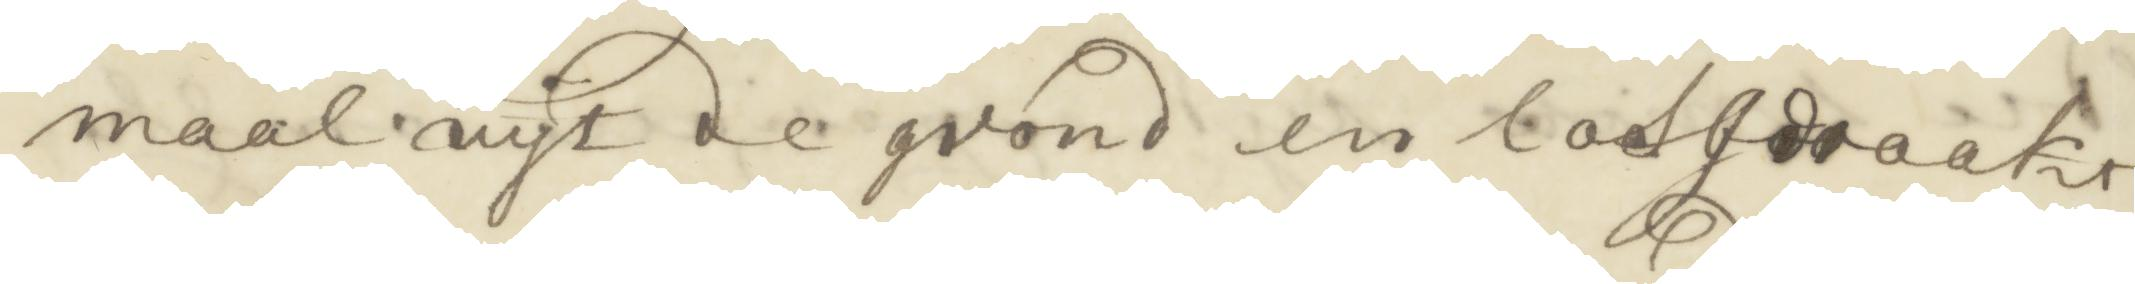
maal uijt de grond en los geraakt
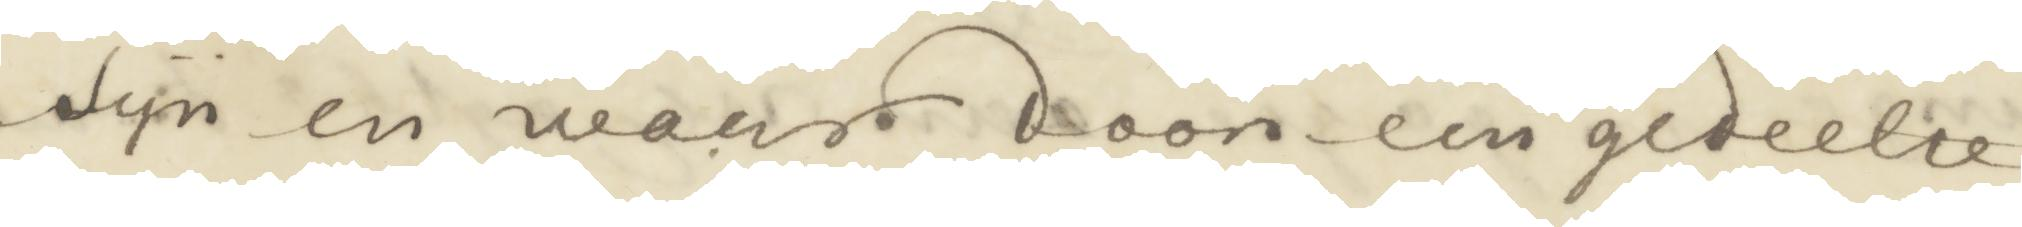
sijn en waar door een gedeelte
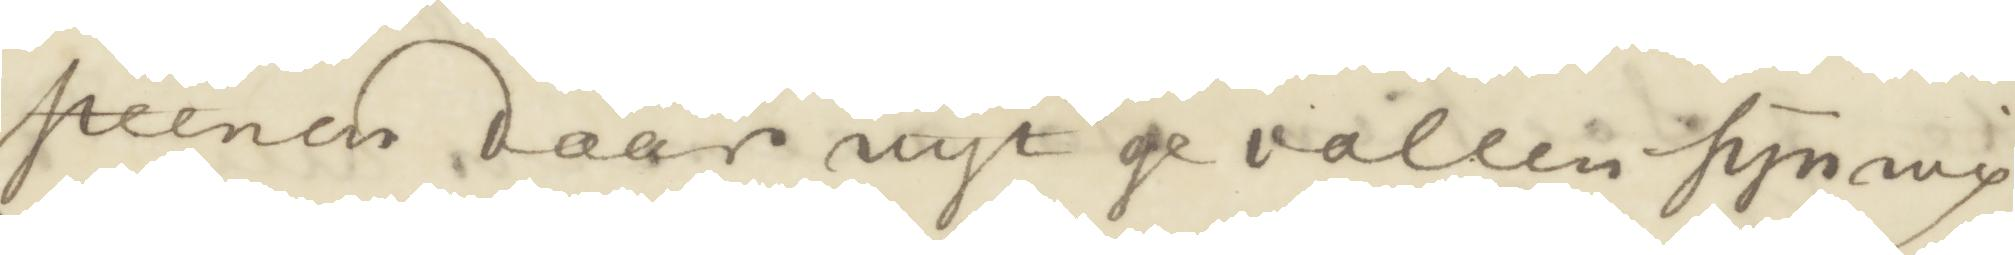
steenen daar uijt gevallen sijn wij
